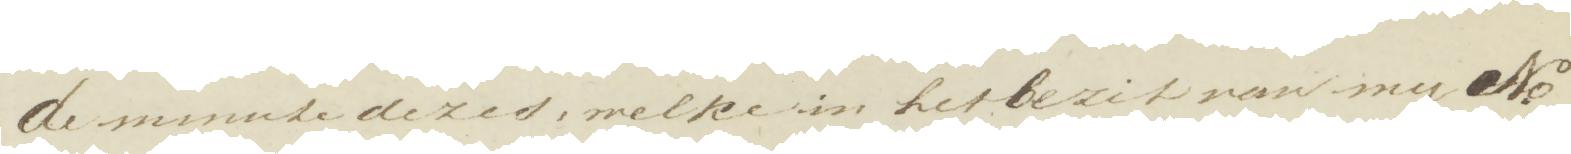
de minute dezes, welke in het bezit van my No
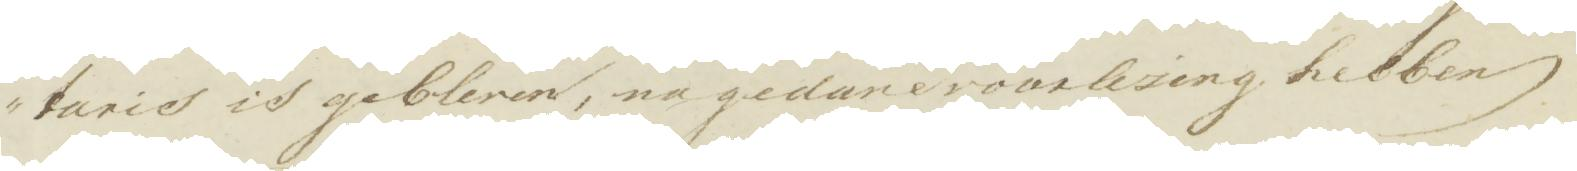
„taris is gebleven, na gedane voorlezing hebben
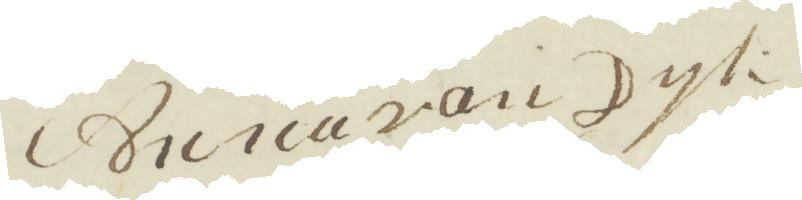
Anna van Dyk
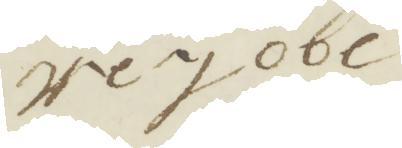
we j obe
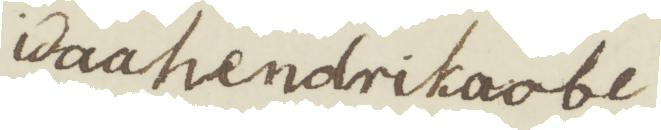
idaahendrikaobe
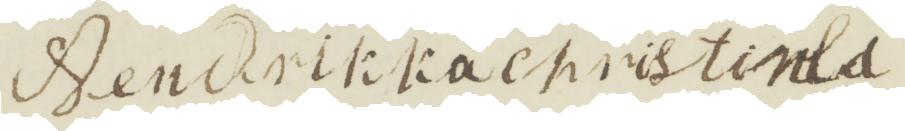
Hendrikkachristina
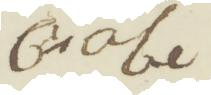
Grobe
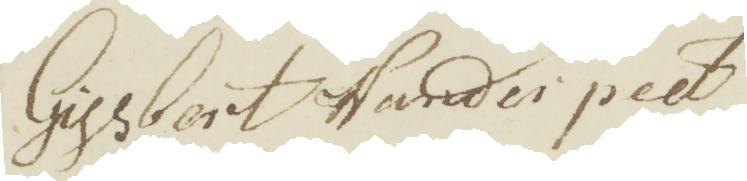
Gijsbert Vander peet
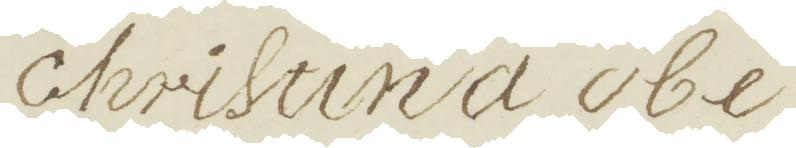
christina obe
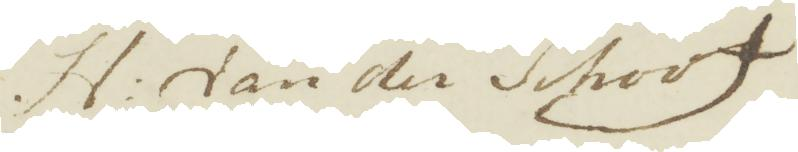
H: van der schoof
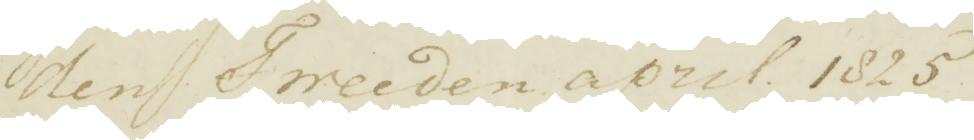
den Tweeden april 1825.
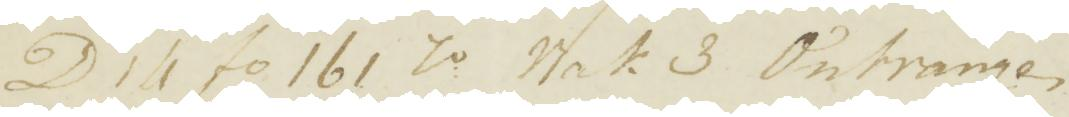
D 14 fo 161 r:o Vak 3 Ontvangen
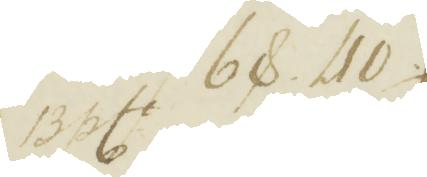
13 pct 68. 40
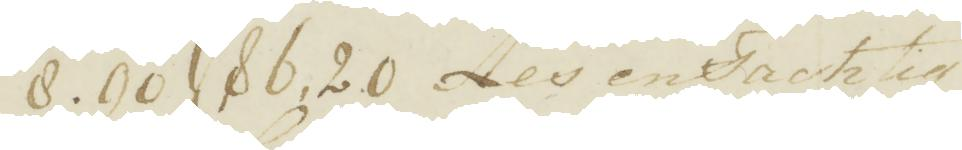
8.90 ) 86,20 Zes en Tachtig
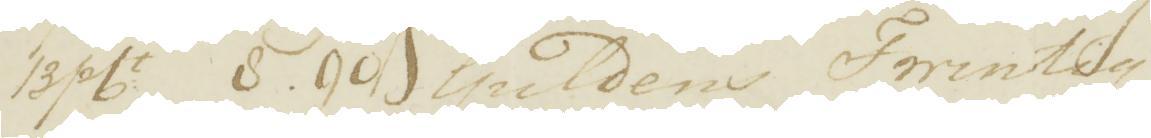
13 pc=t 8 .90 ) Guldens Twintig
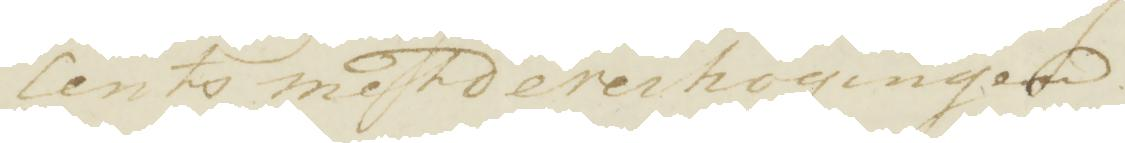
Cents met deverhogingen
